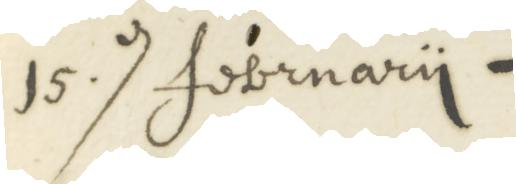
15.en februarij
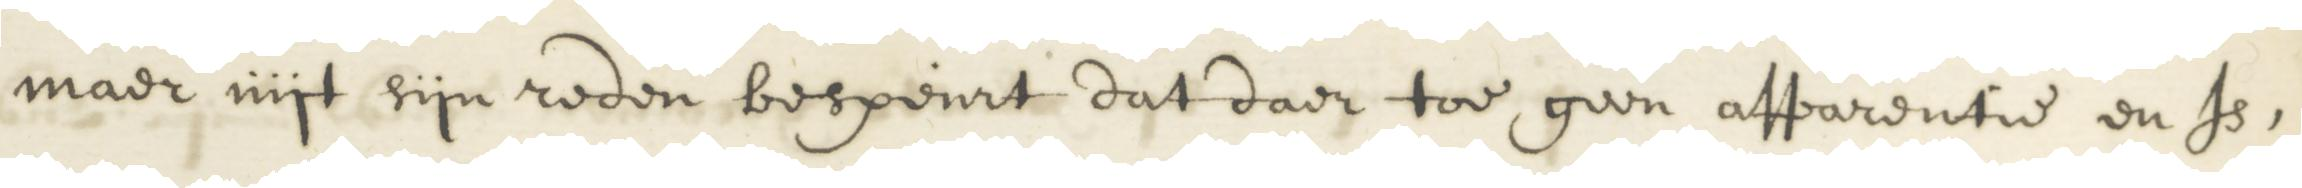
maer uijt sijn reden bespeurt dat daer toe geen apparentie en Js,
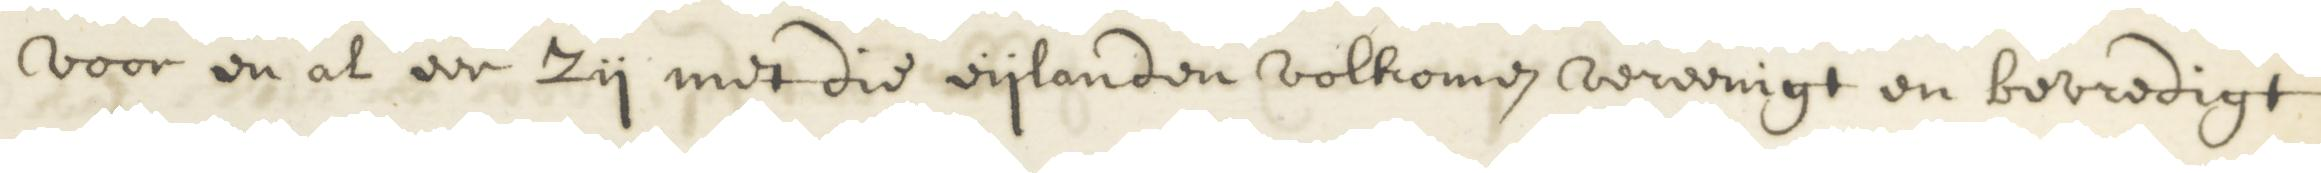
voor en al eer zij met die eijlanden volkomen vereenigt en bevredigt
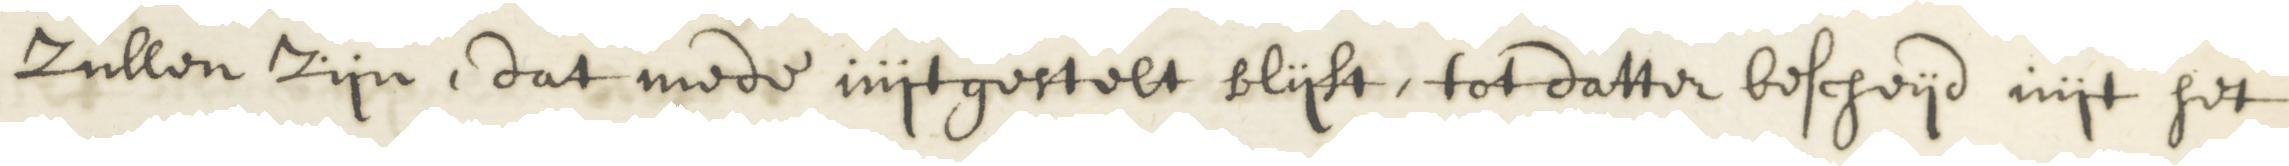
zullen zijn, dat mede uijtgestelt blijft, tot datter bescheijd uijt het
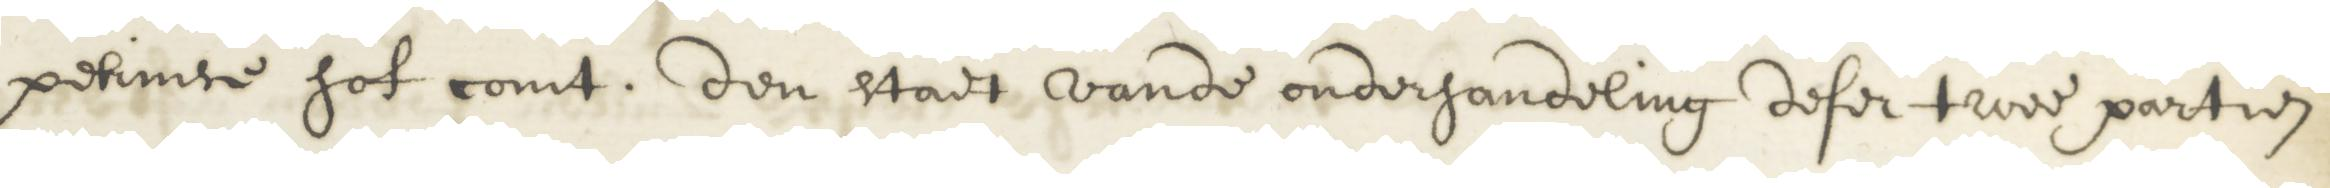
pekinse hof comt. den staet vande onderhandeling deser twee partien
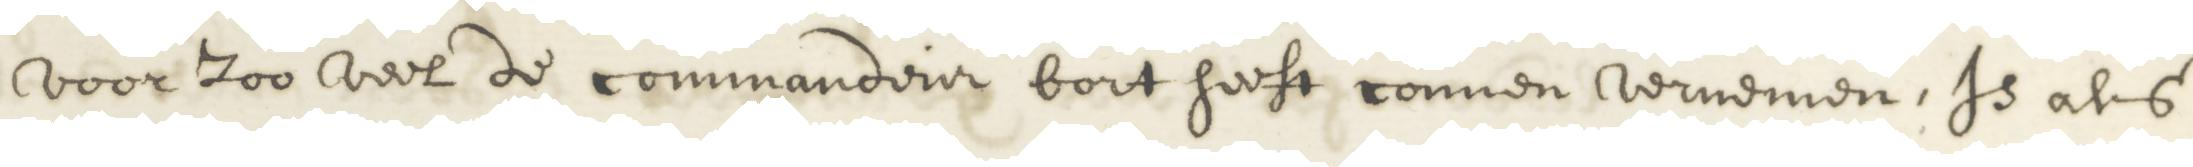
voor zoo wel de commandeur bort heeft connen vernemen, Js als
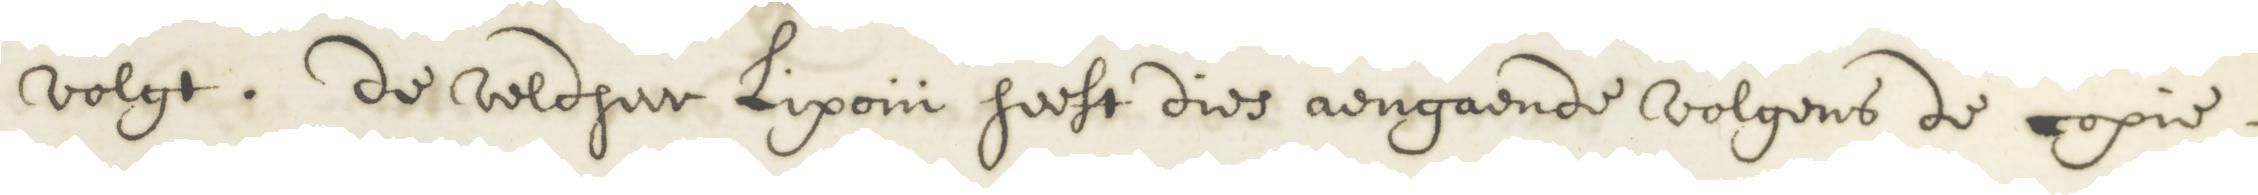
volgt. De veldheer Lipoui heeft dien aengaende volgens de copie
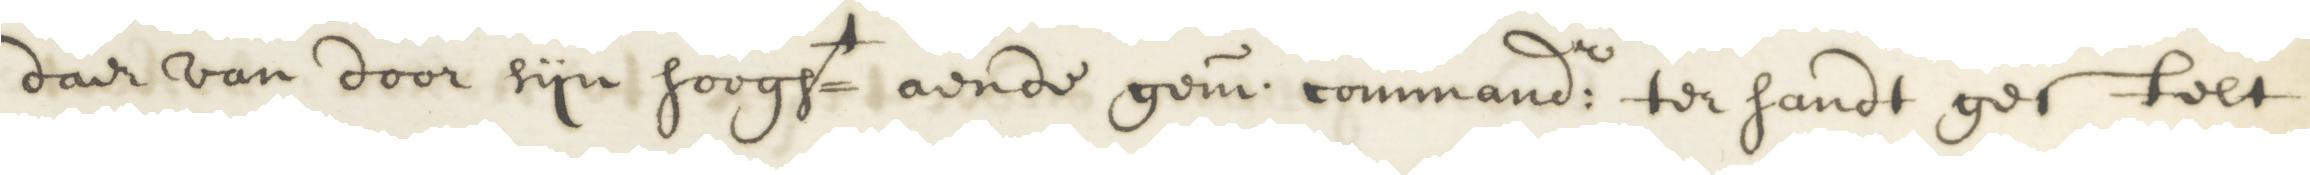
daer van door sijn hoogh=t aende gem. command:r ter handt gestelt
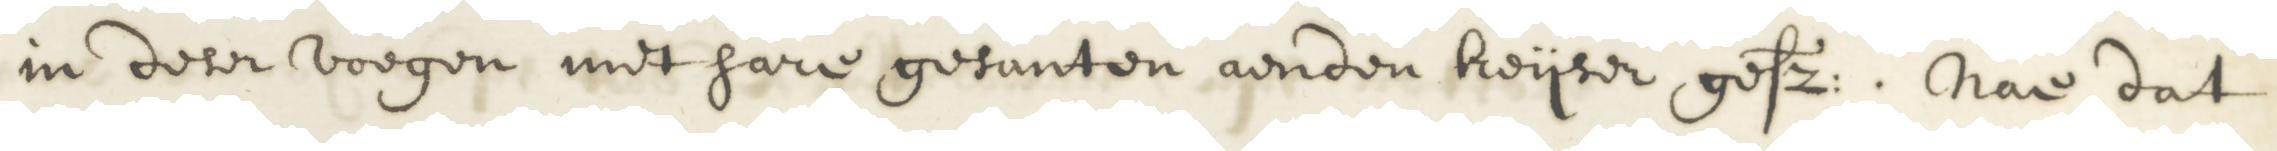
in deser voegen met hare gesanten aenden keijser gesz:. nae dat
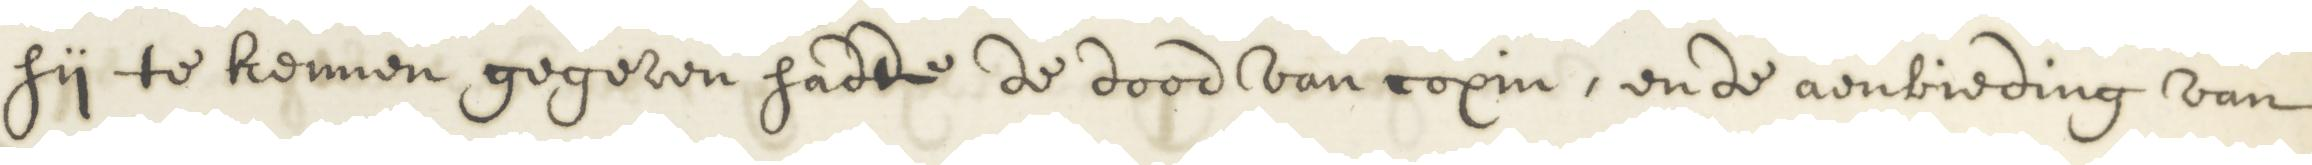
hij te kennen gegeven hadde de dood van coxin, en de aenbieding van
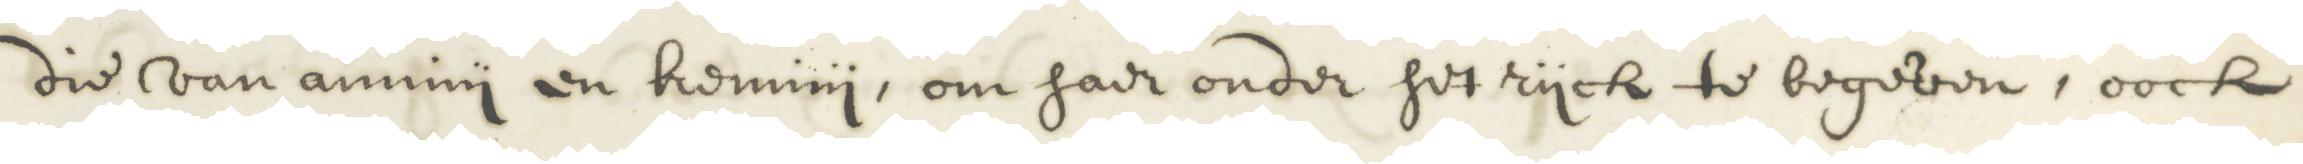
die van aimuij en kemuij om, haer onder het rijck te begeven, oock
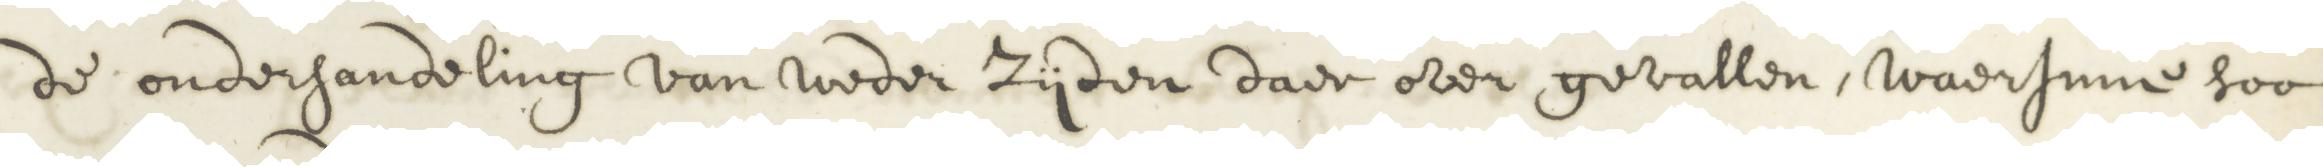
de onderhandeling van weder zijden daer over gevallen, waerjnne soo
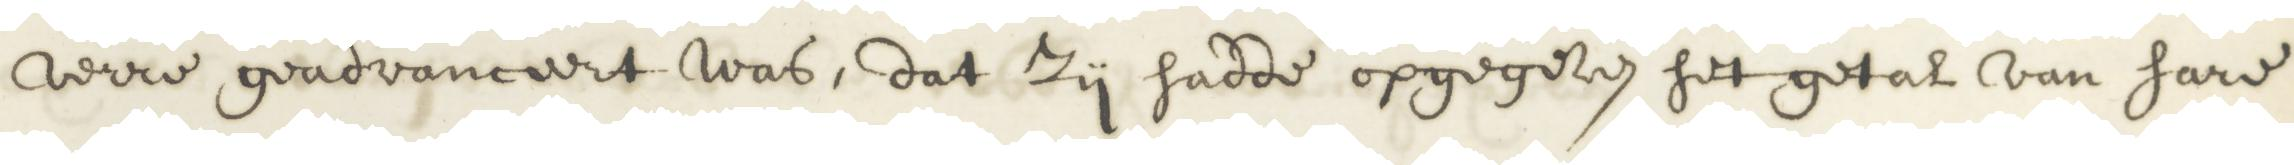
verre geadvanceert was, dat zij hadde opgegeven het getal van hare
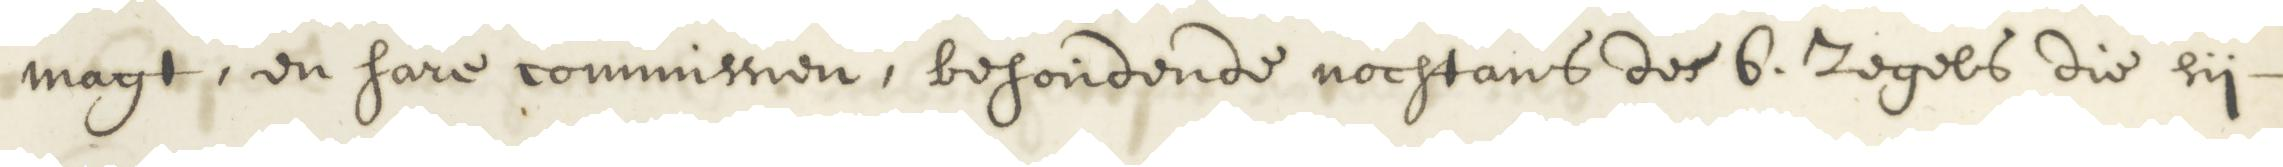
magt, en hare commissien, behoudende nochtans der 6. zegels die sij
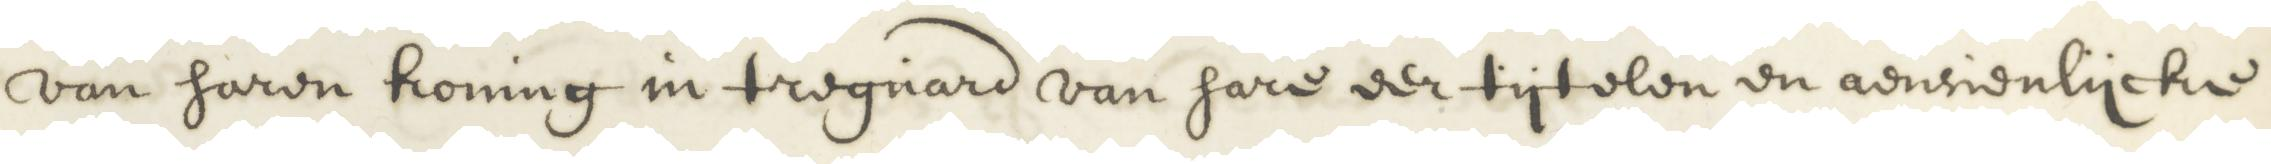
van haren koning in t reguard van hare eer tijtelen en aensienlijcke
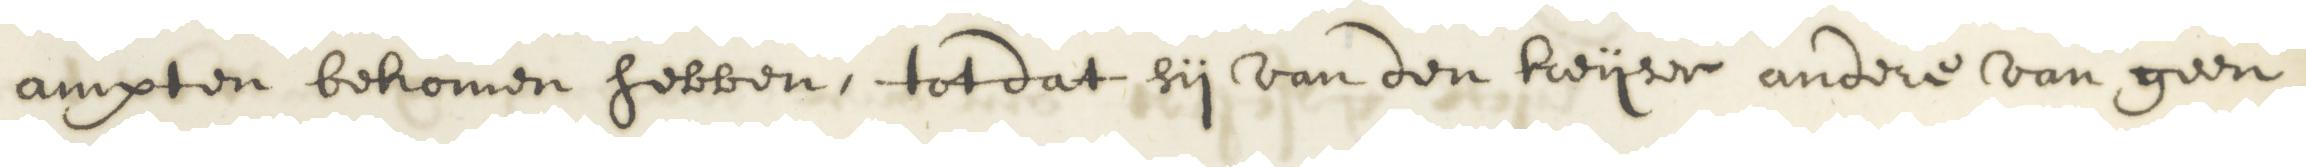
ampten bekomen hebben, totdat sij van den keijser andere van geen
